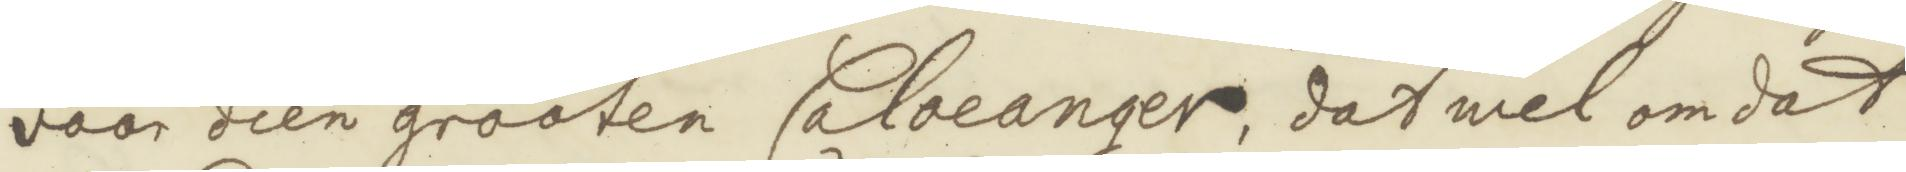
voor dien grooten Caloeanger, dat wel om dat
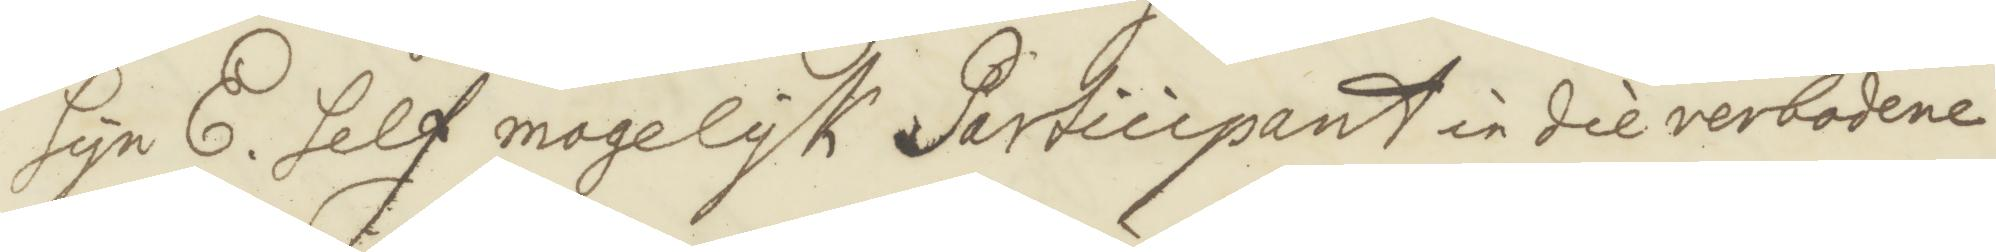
sijn E. self mogelijk Participant in die verbodene
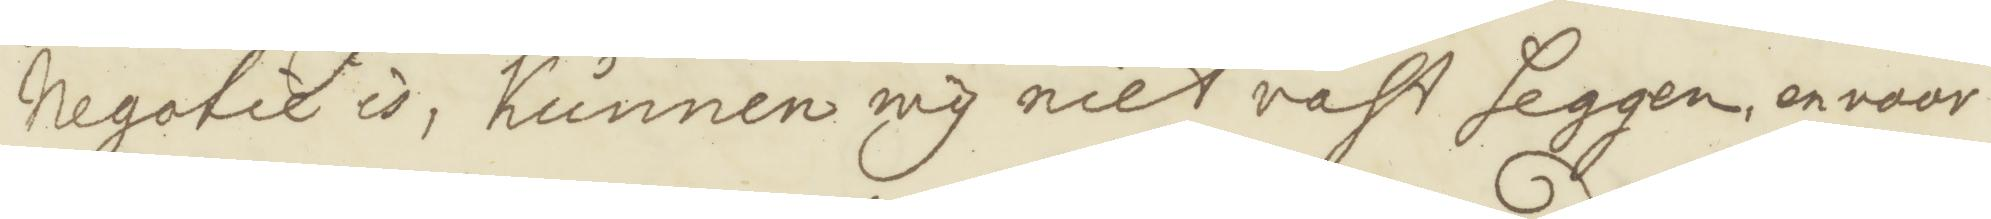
negotie is, kunnen wij niet vast seggen, en voor
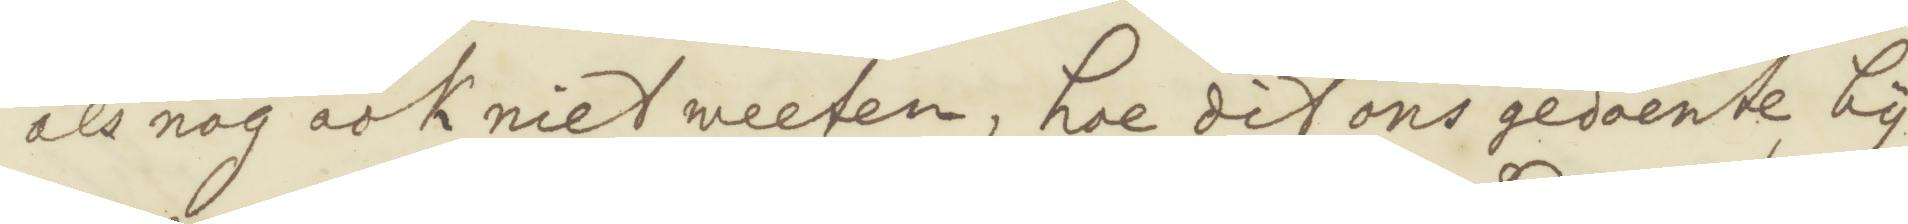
als nog ook niet weeten, hoe dit ons gedoente bij
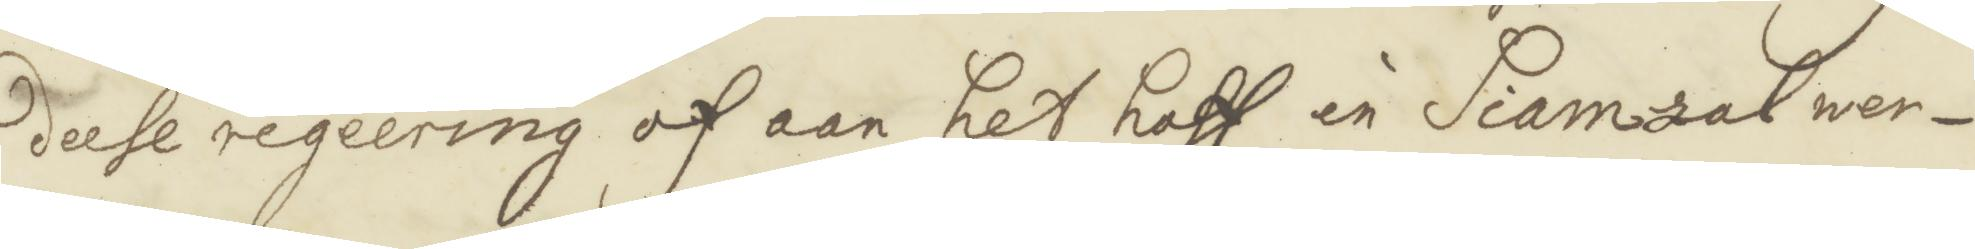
deese regeering of aan het hoff in Siam zal wer–
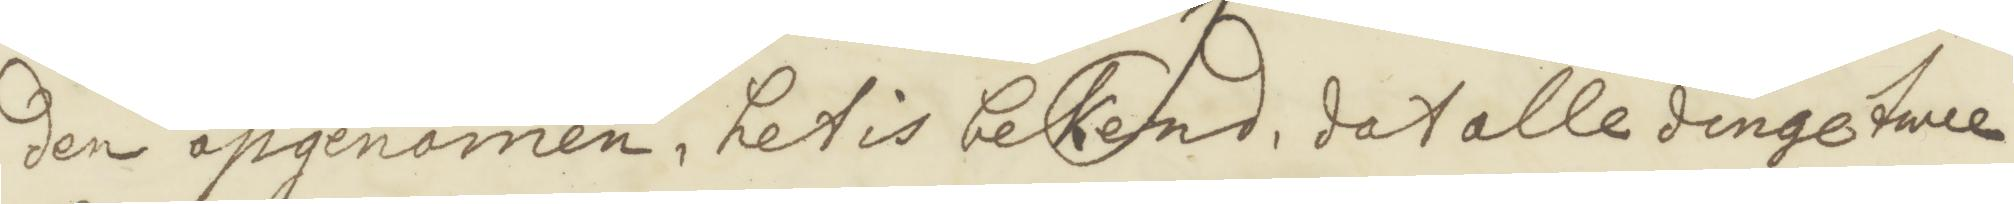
den opgenomen, het is bekend, dat alle dinge twee
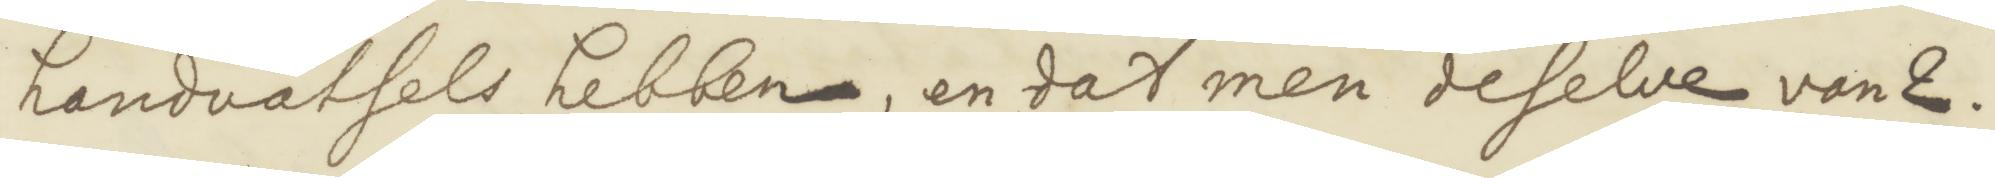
handvatsels hebben, en dat men deselve van 2.
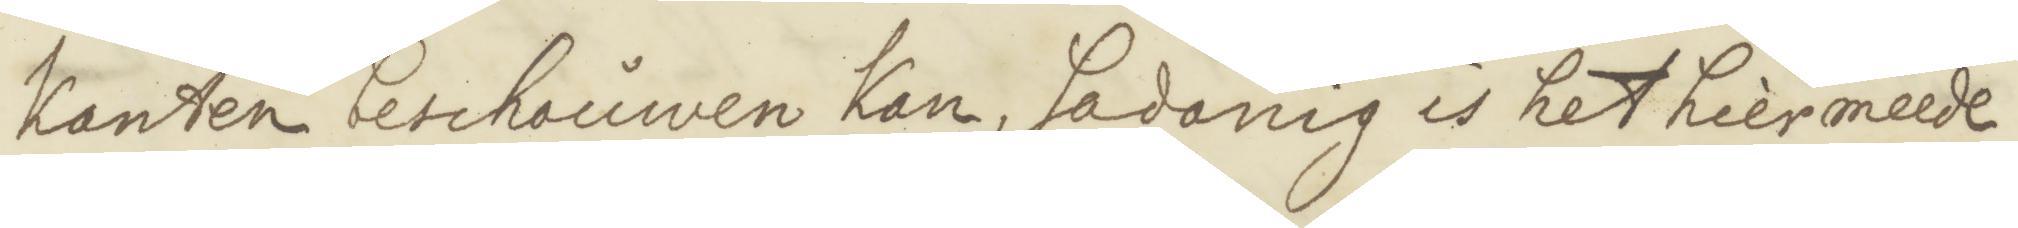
kanten beschouwen kan, sodanig is het hier meede
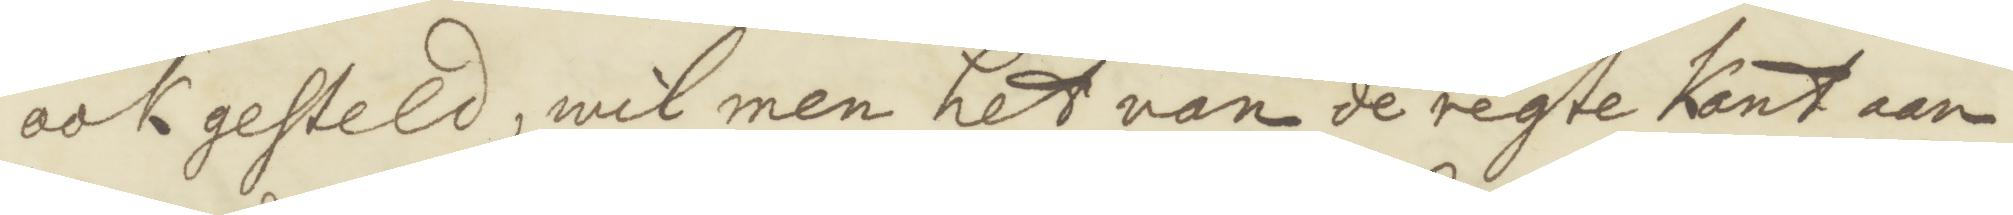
ook gesteld, wil men het van de regte kant aan
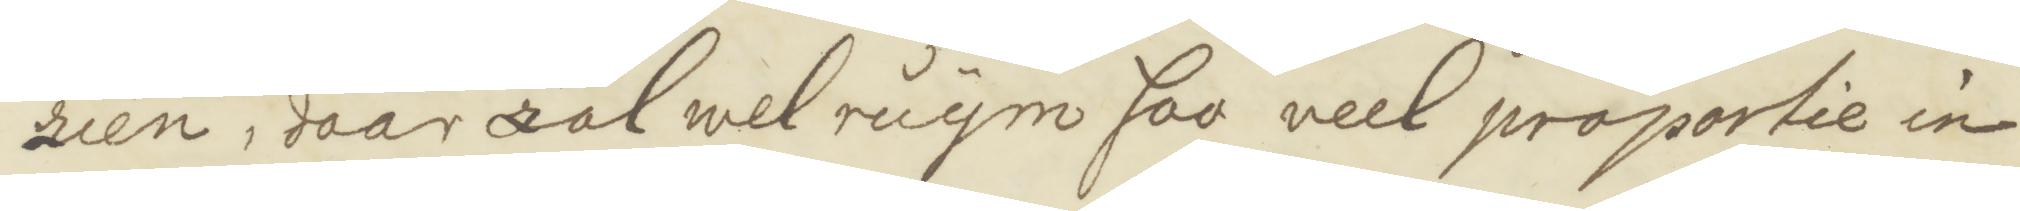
zien, daar zal wel ruijm soo veel proportie in
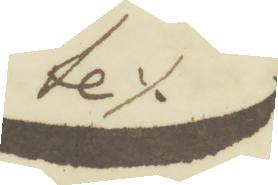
te ./.
